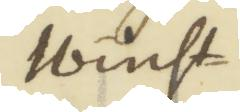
winst
